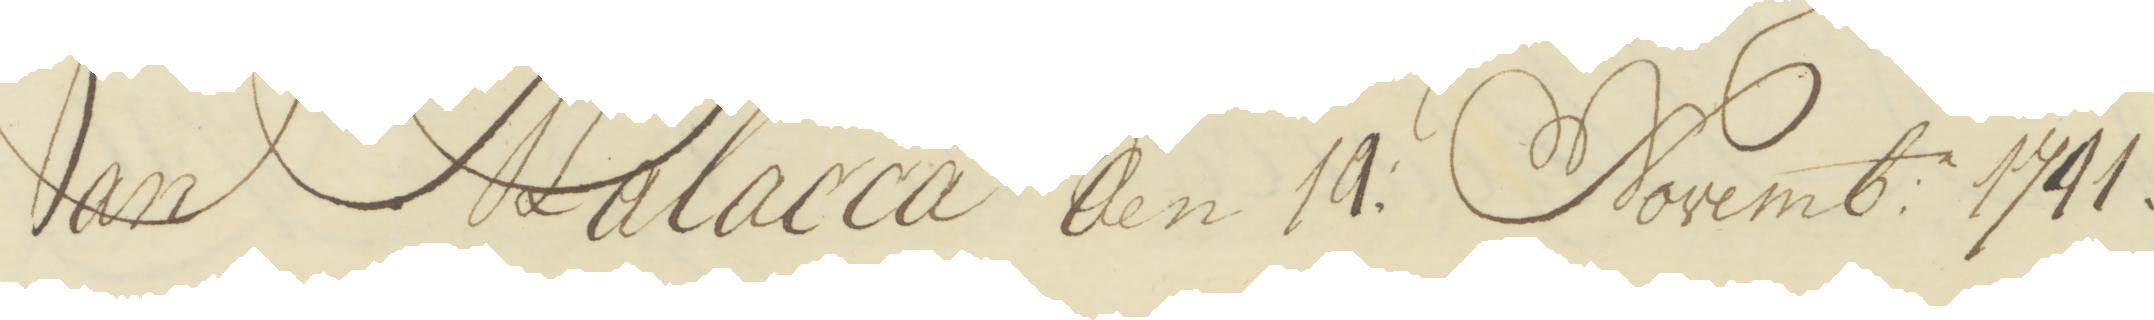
Van Malacca den 14:' Novemb:r 1741.
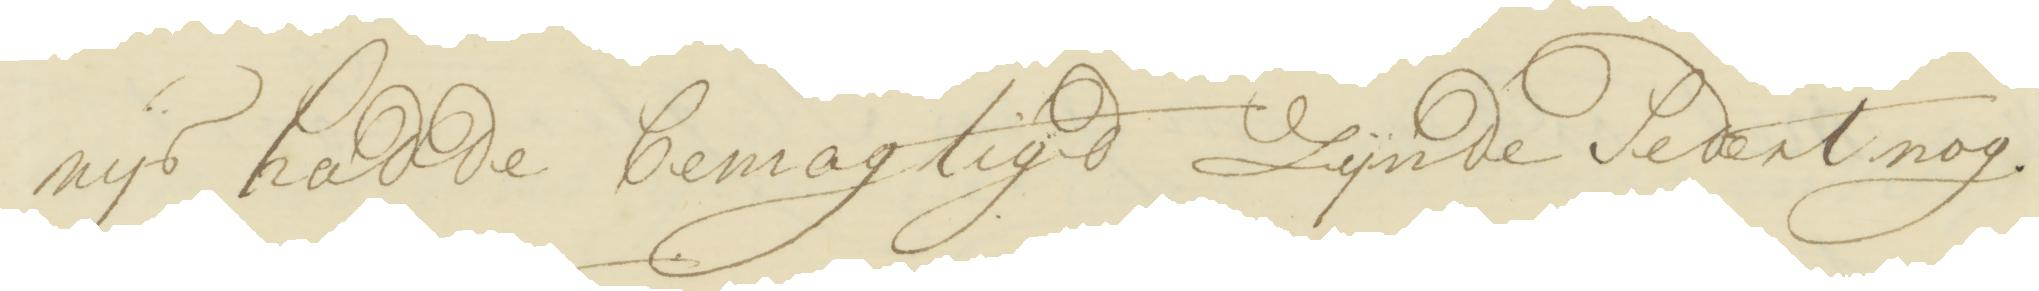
rijs hadde bemagtigd Zijnde Sedert nog
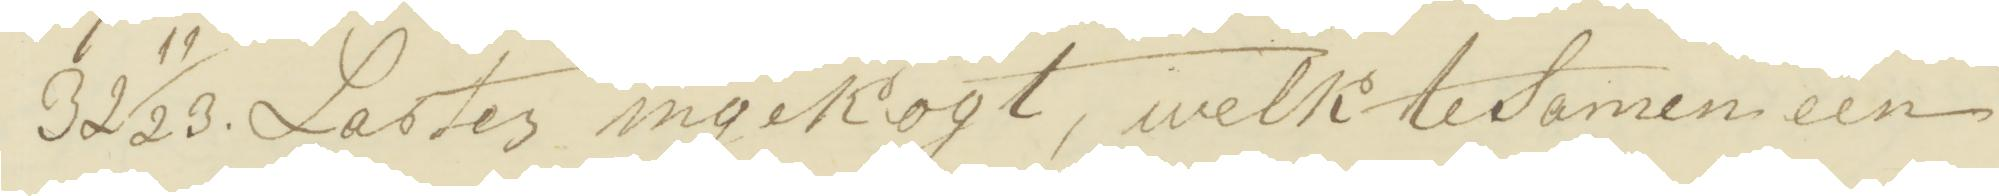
32 11/23. Lasten ingekogt, welk te samen een
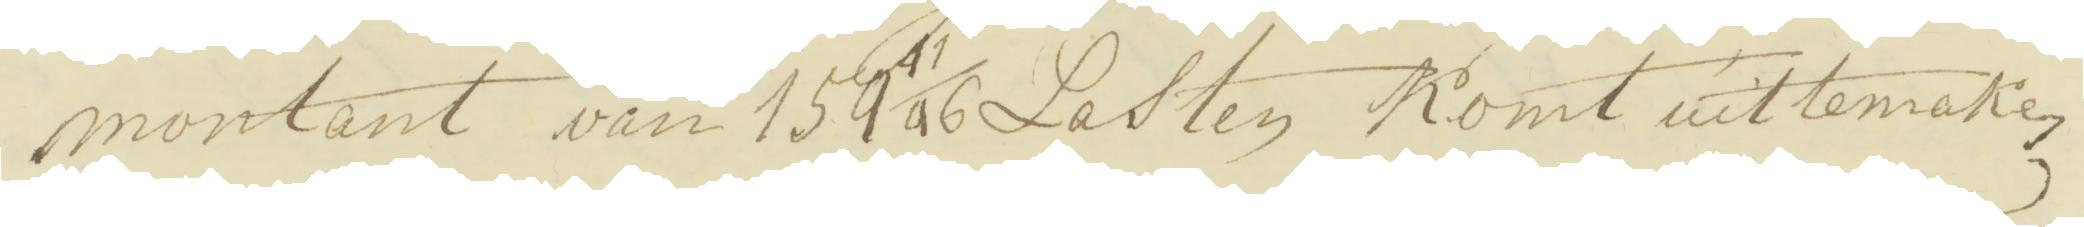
montant van 154 41/46 Lasten Komt uit te maken
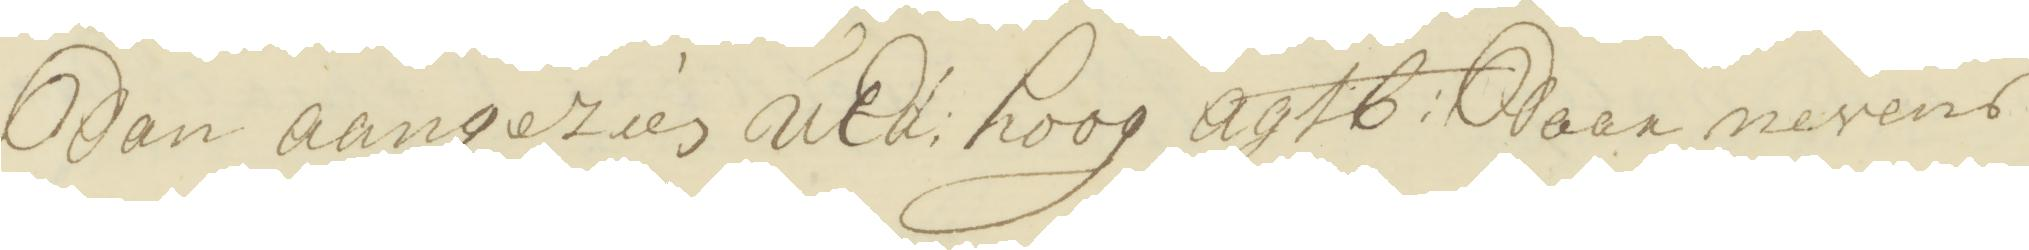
dan aangezien uEd: hoog agtb: daar nevens
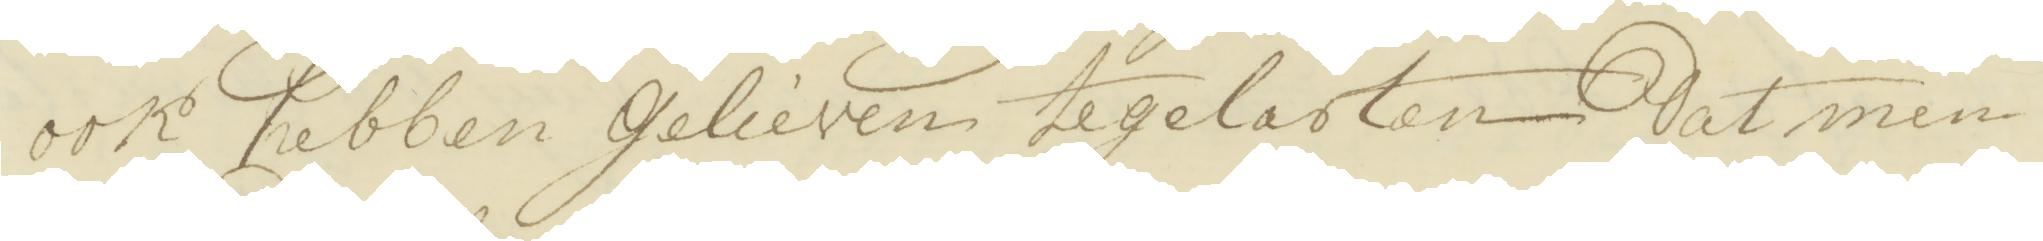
ook hebben gelieven te gelasten dat men
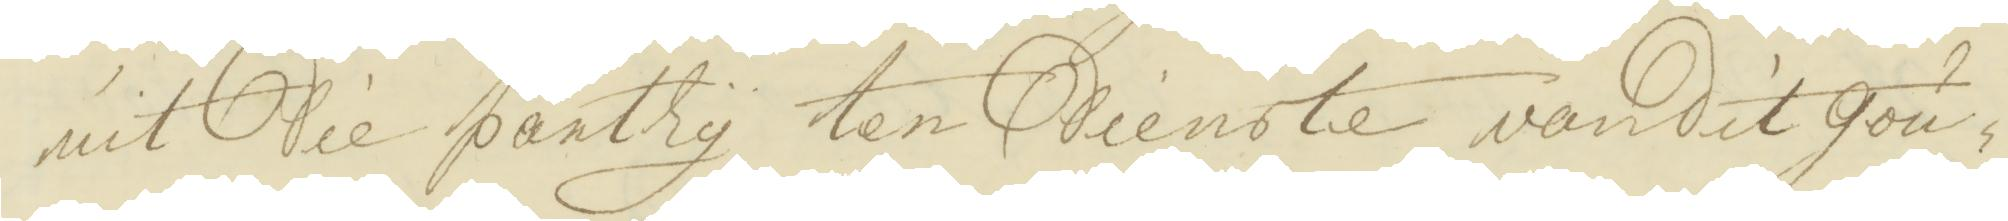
uit die parthij ten dienste van dit gou„
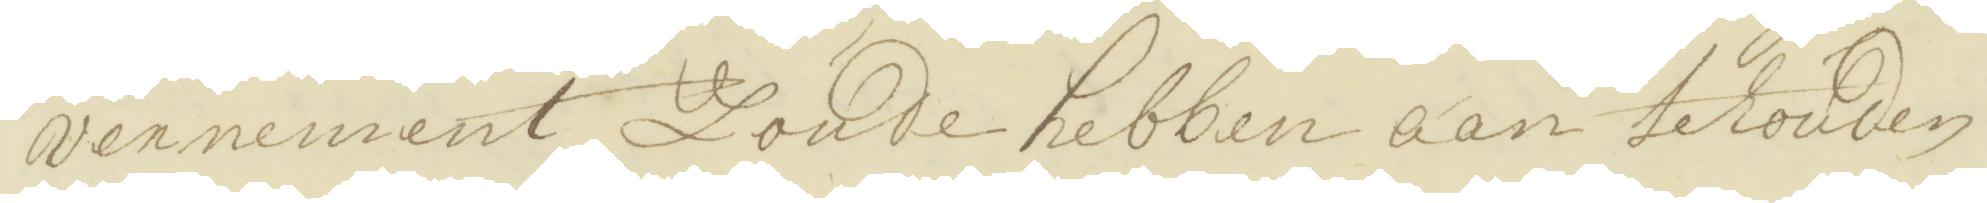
vernement Zoude hebben aan te houden
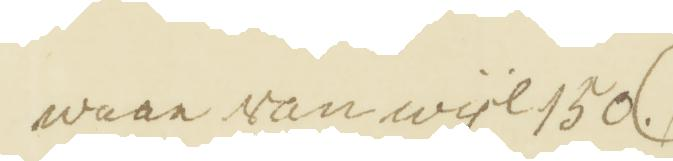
waar van wijl 150
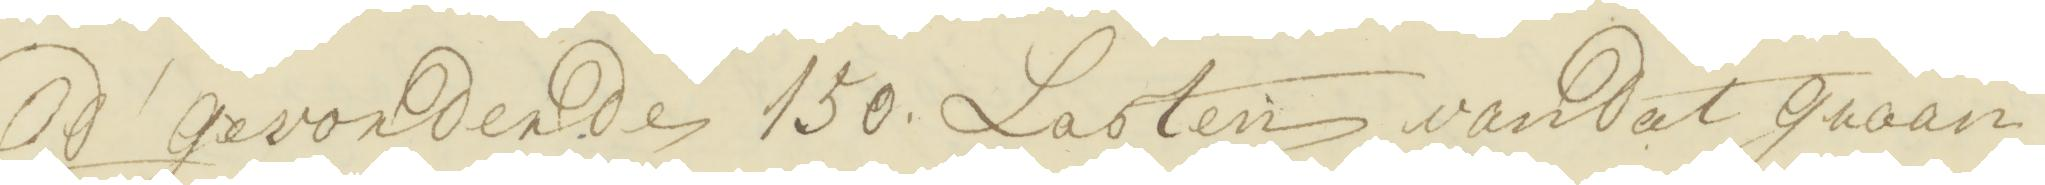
d’ gevorderde 150: Lasten van dat graan
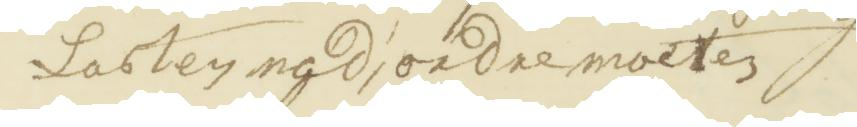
Lasten na d; ordre moeten
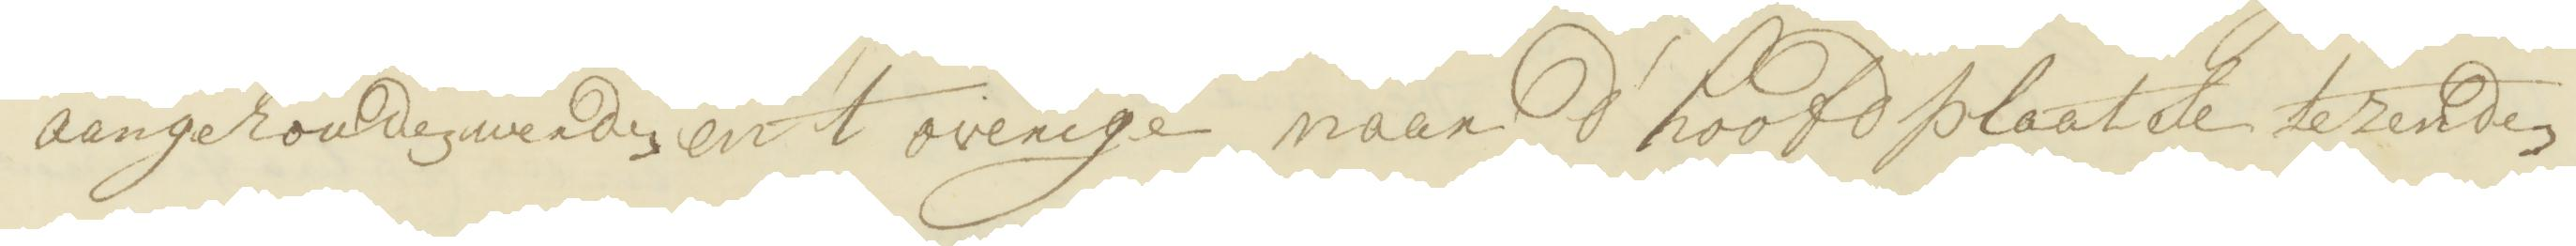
aangehouden werden en ’t overige naar d’hoofd plaatse te zenden
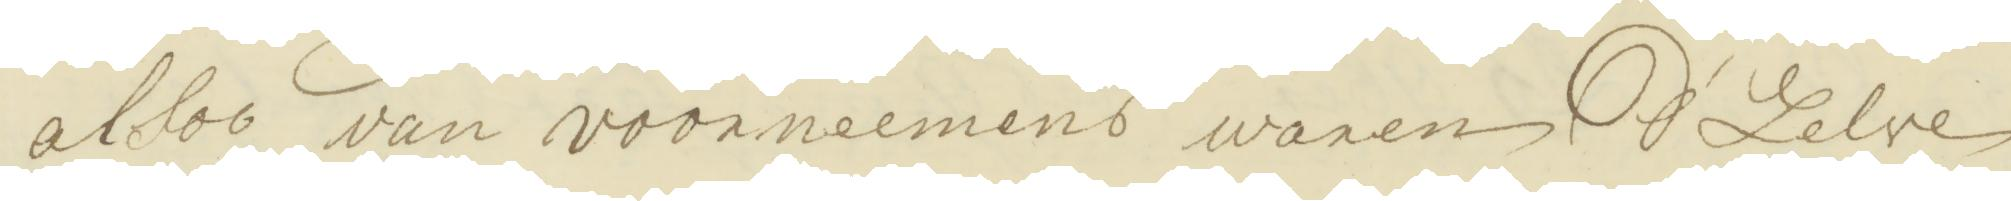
alsoo van voorneemens waren d’ Zelve
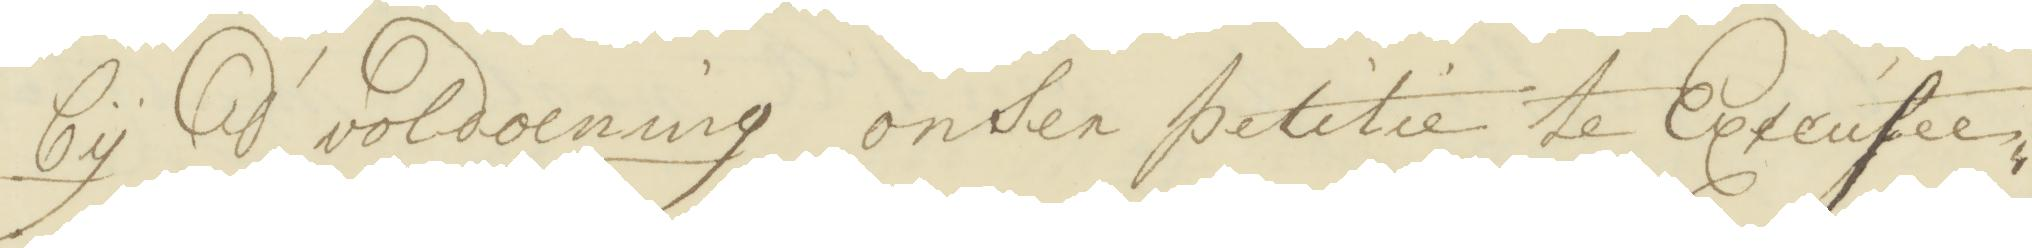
bij d’voldoening onser petitie te Execusee„
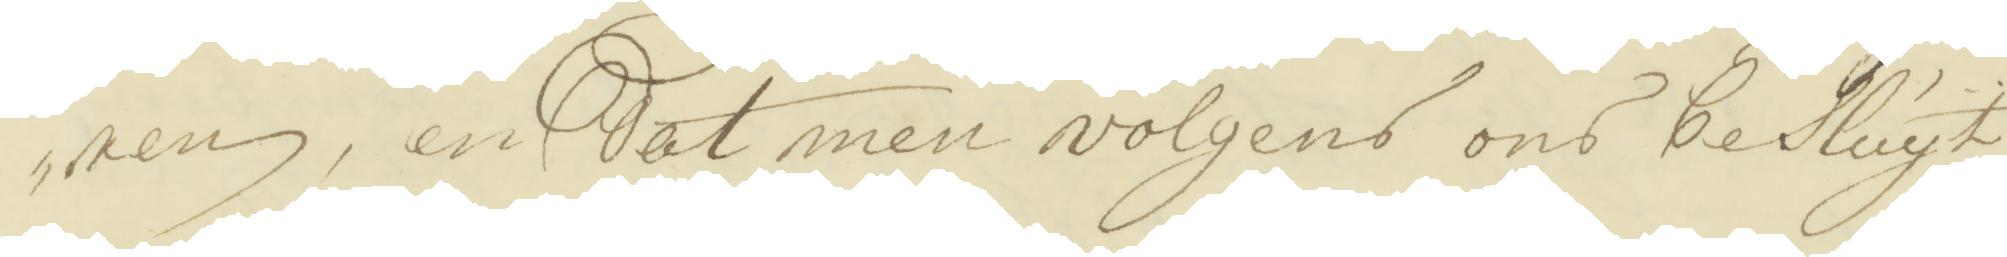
„ren, en dat men volgens ons besluijt
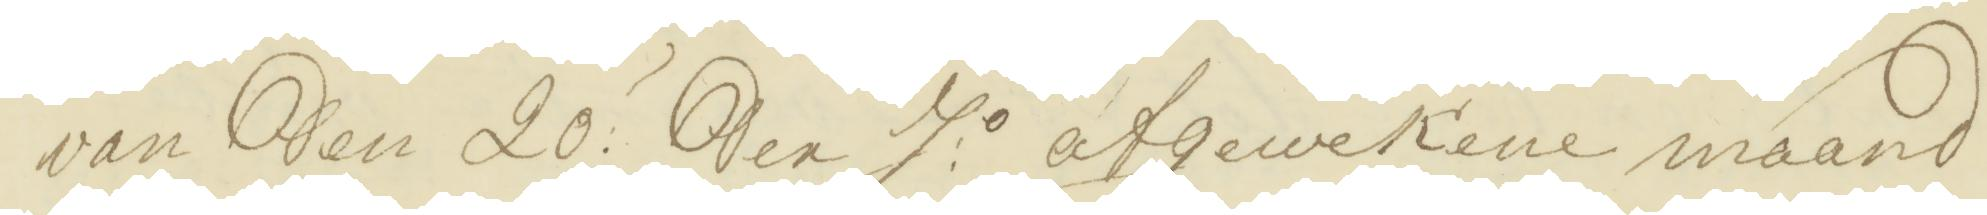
van den 20:' der J:o afgewekene maand
